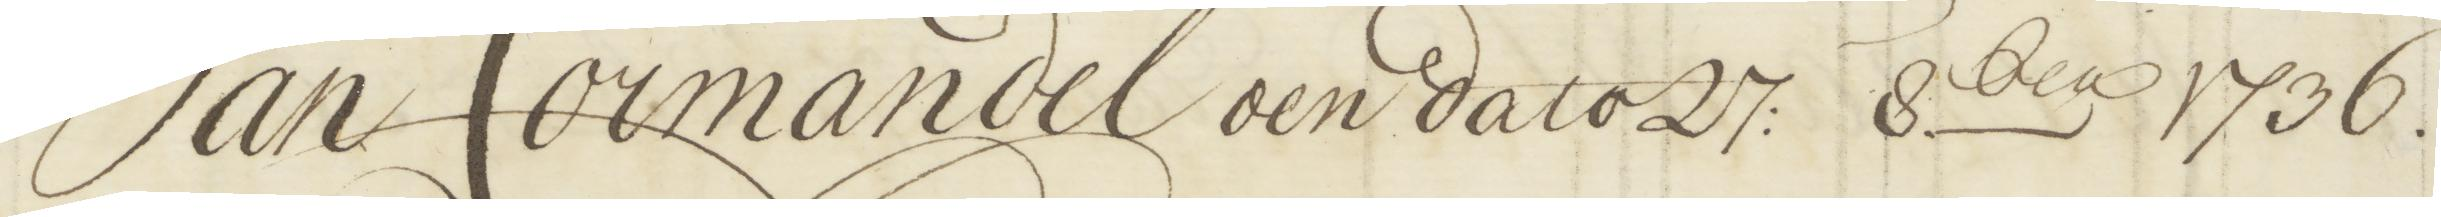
Van Cormandel den dato 27:' 8._ber 1736.
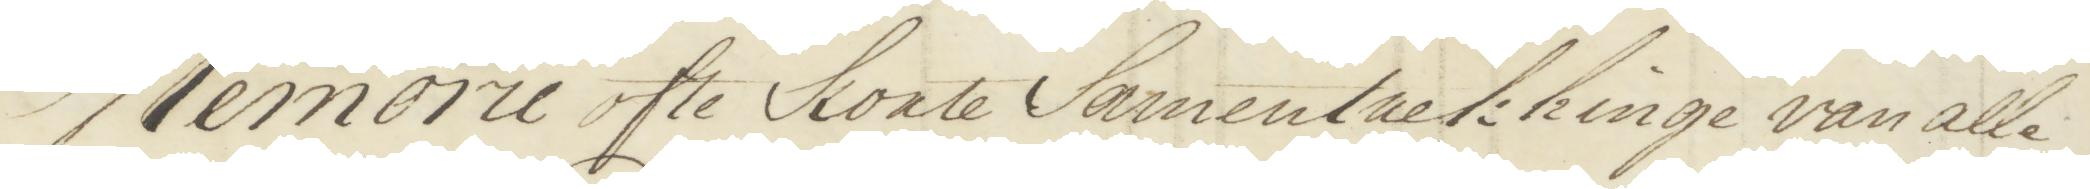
Memorie ofte korte samentrekkinge van alle
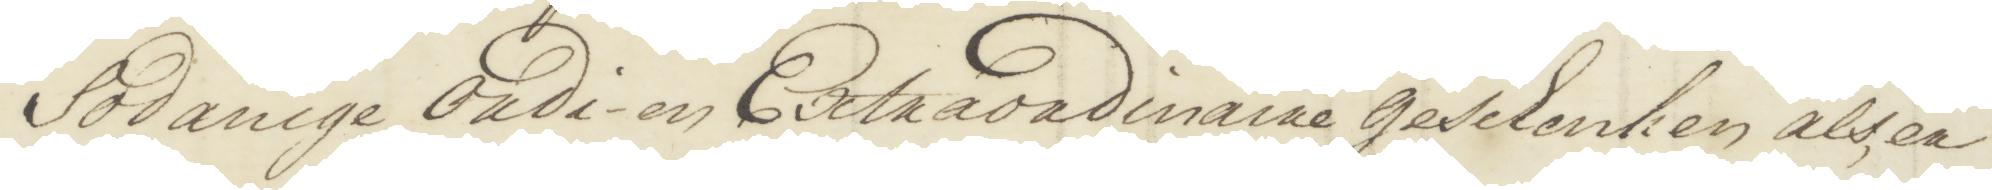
sodanige ordi-en Extraordinaire geschenken als, er
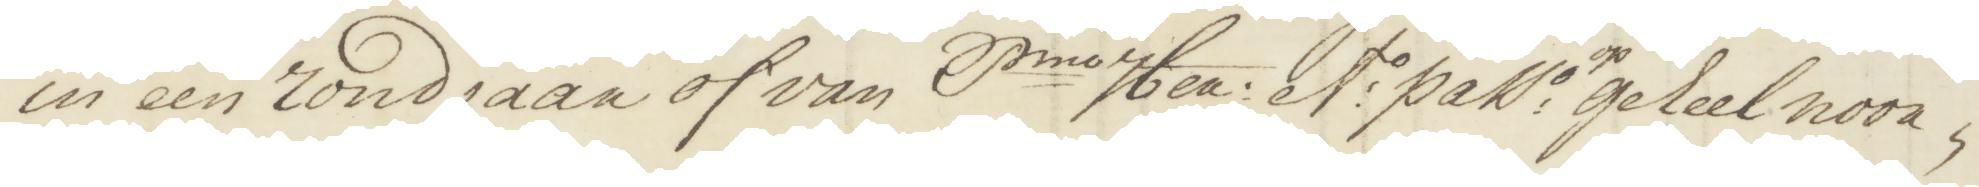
in een rondjaar of van P=mo 7ber: A:o pass:o op geheel noor„
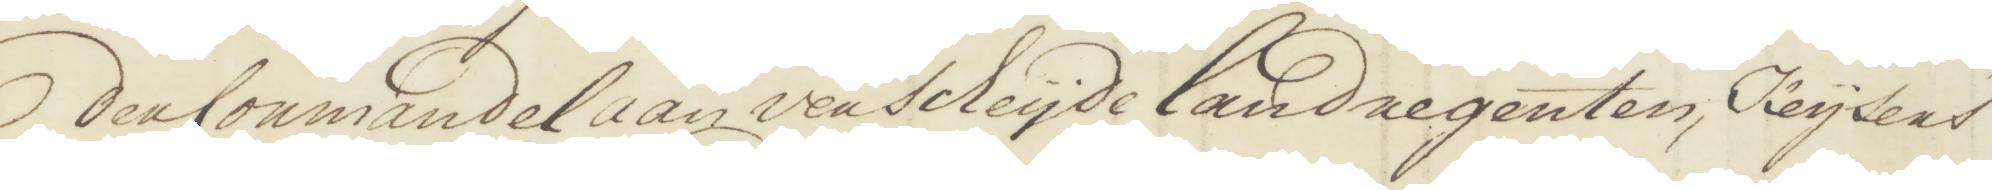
der Cormandel aan verscheijde land regenten, keijsers
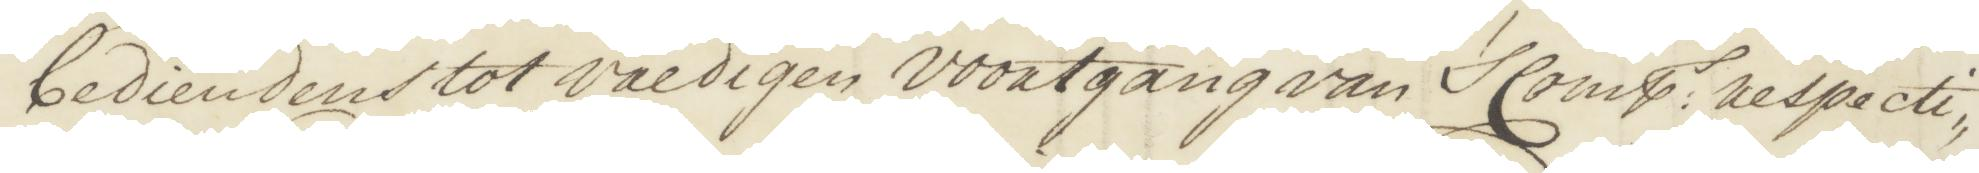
bediendens tot vredigen voortgang van ’s Comp:s respecti„
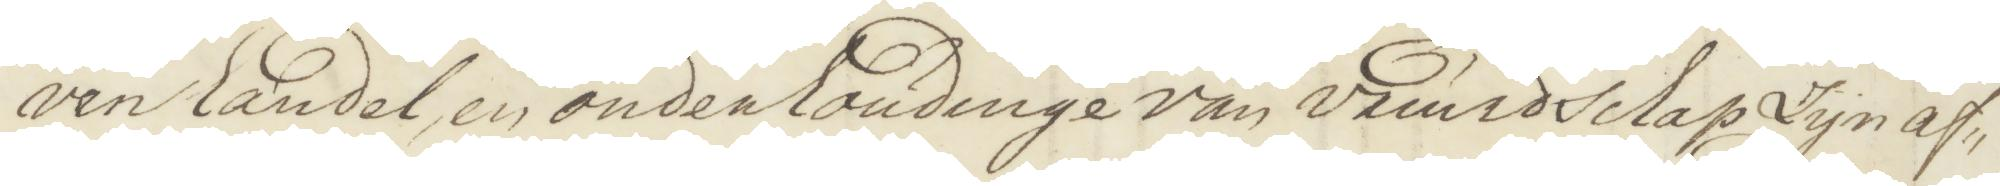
ven handel, en onderhoudinge van vrundschap zijn af„
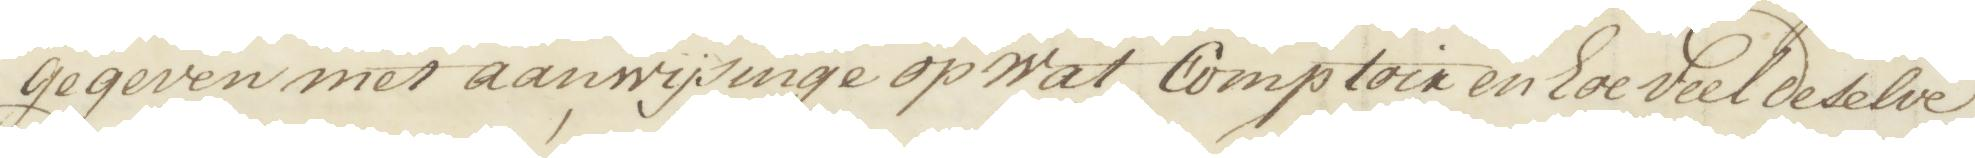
gegeven met aanwijsinge op wat Comptoir en hoe veel deselve
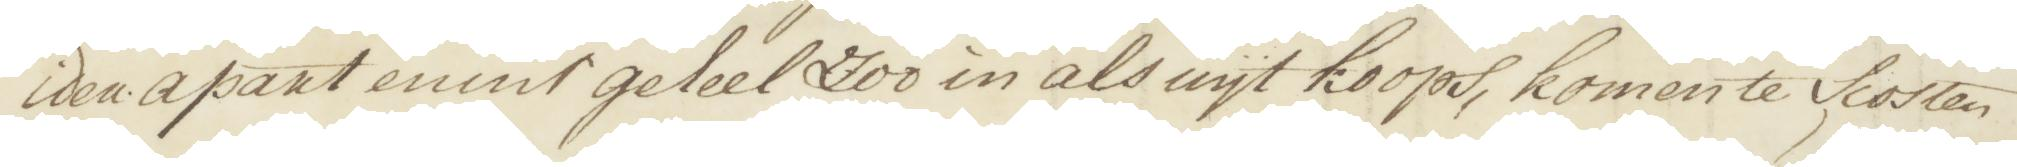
ider apart en in't geheel zoo in als uijt koops, komen te kosten
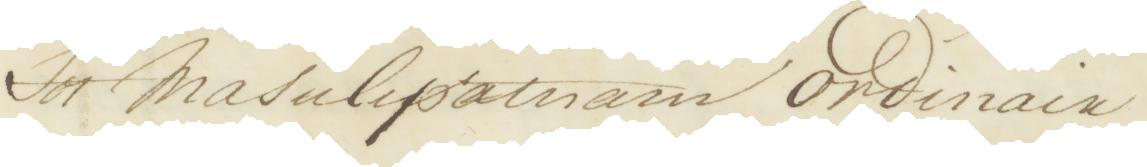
Tot Masulipatnam ordinair
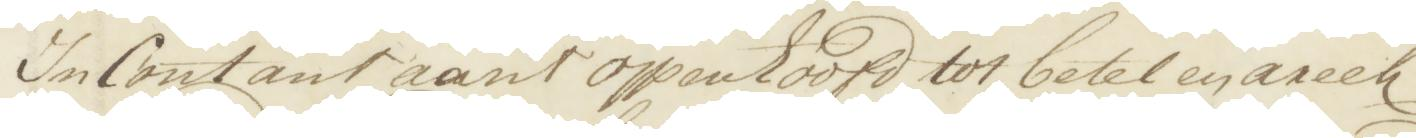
In Contant aan't opperhoofd tot betel en areek
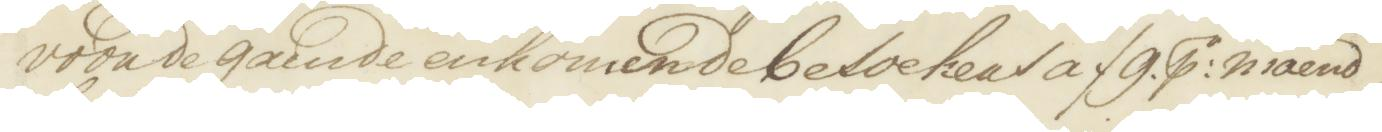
voor de gaende en komende besoekers á ƒ 9. p:r maend
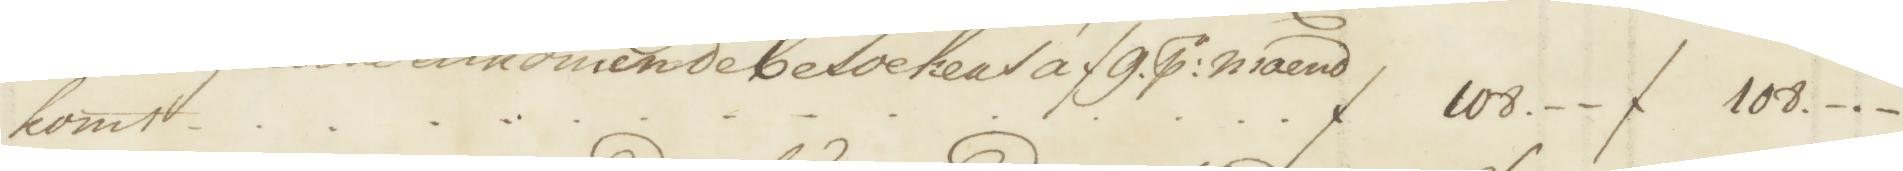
komt - . . . . . . . . . . . . . . . ƒ 108. — — ƒ 108. — . —
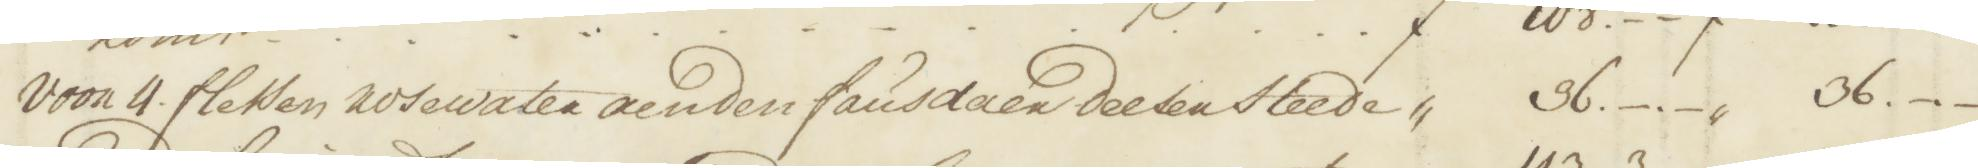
voor 4. flessen rosewater aen den faus daer deeser steede „ 36. — . — „ 36. — . —
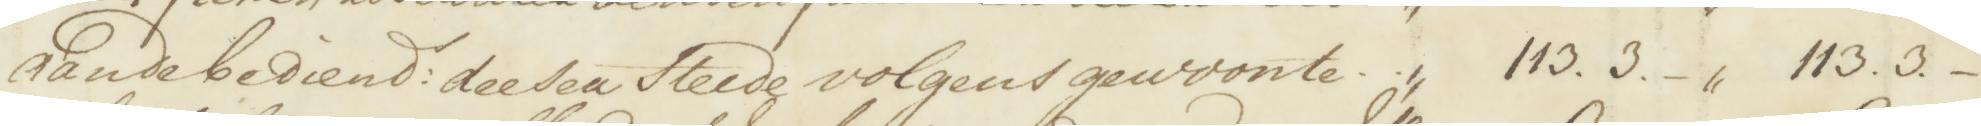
aan de bediend:s deeser steede volgens gewoonte . . „ 113. 3. — „ 113. 3. —
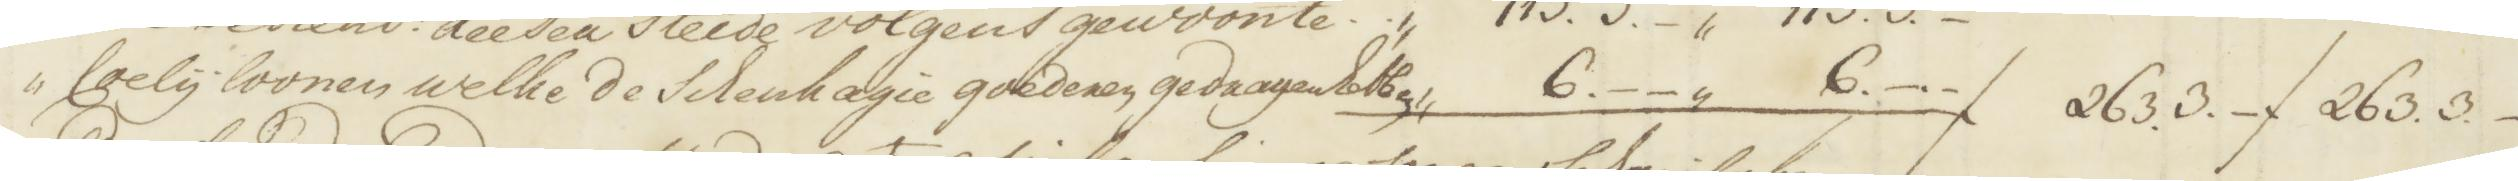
„ Coelij loonen welke de schenkagie goederen gedragen hebben „ 6. — — „ 6. — . — ƒ 263. 3. — ƒ 263. 3. —
